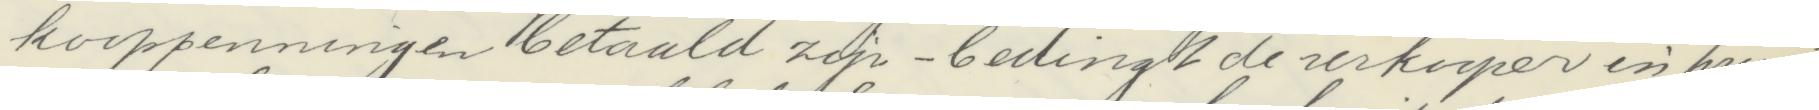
kooppenningen betaald zijn - bedingt de verkorper in privé
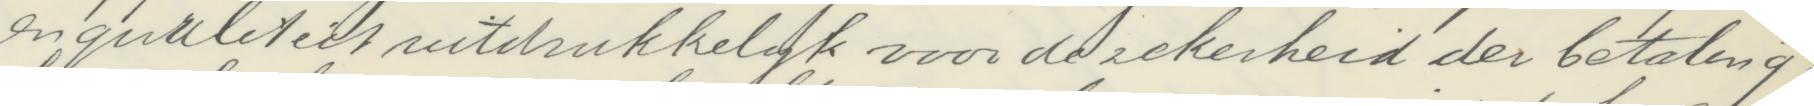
in qualiteit uitdrukkelyk voor de zekerheid der betaling,
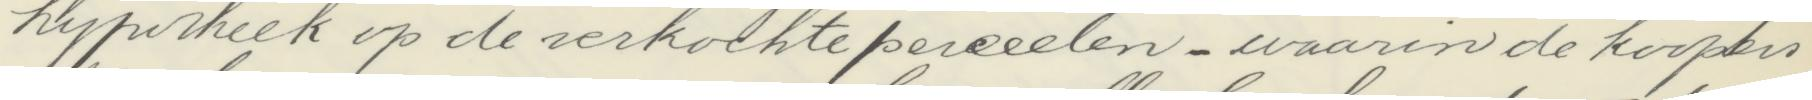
hypotheek op de verkochte perceelen - waarin de koopers
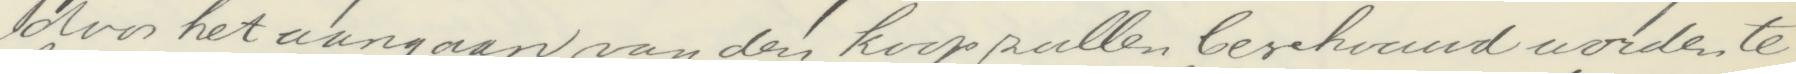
door het aangaan van den koop zullen beschouwd worden te
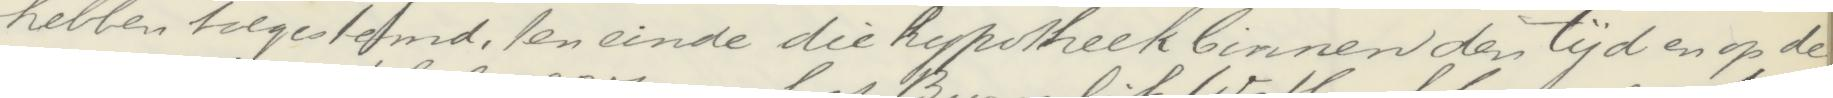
hebben toegestemd, ten einde die hypotheek binnen den tijd en op de
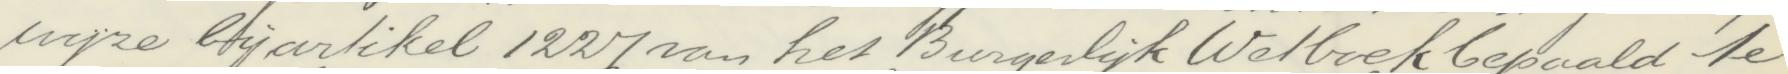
wijze bij artikel 1227 van het Burgerlijk Wetboek bepaald te
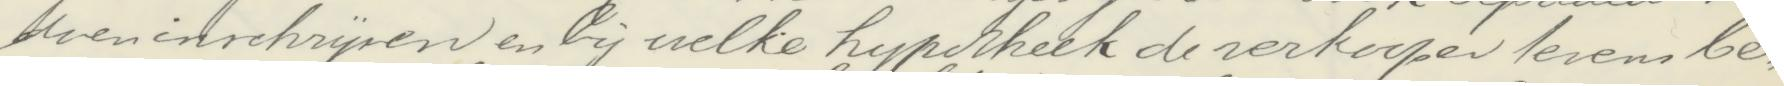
doen inschrijven en bij welke hypotheek de verkooper tevens be„
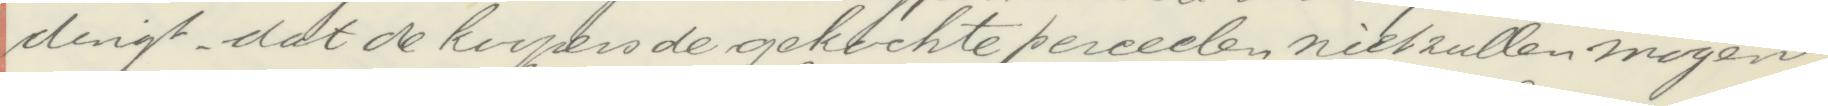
dingt dat de koopers de gekochte perceelen niet zullen mogen
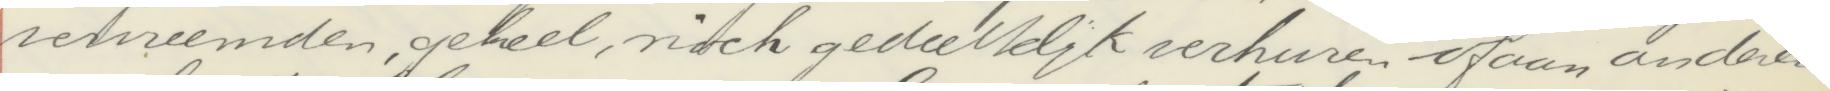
vervreemden geheel, noch gedeelteijk verhuren of aan anderen
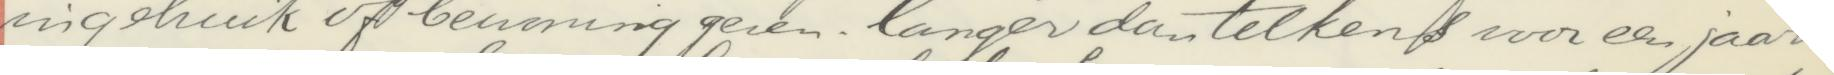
in gebruik of bewaring geven. langer dan telkens voor een jaar
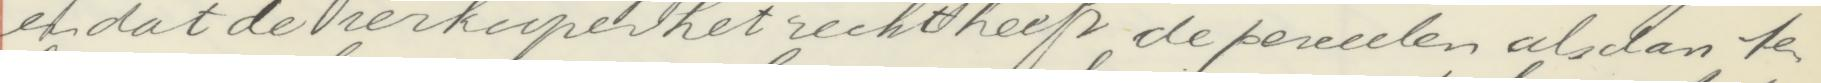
en dat de verkooper het recht heeft de perceelen als dan ten
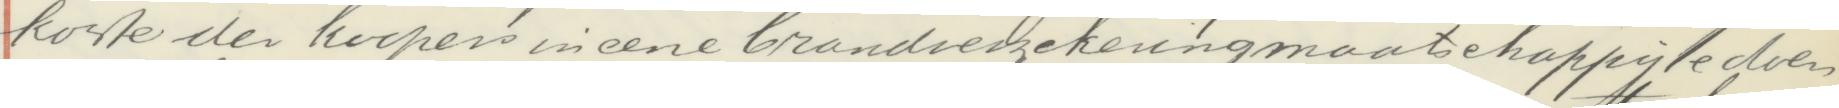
koste der kooper in eene brandverzekering maaschappij te doen
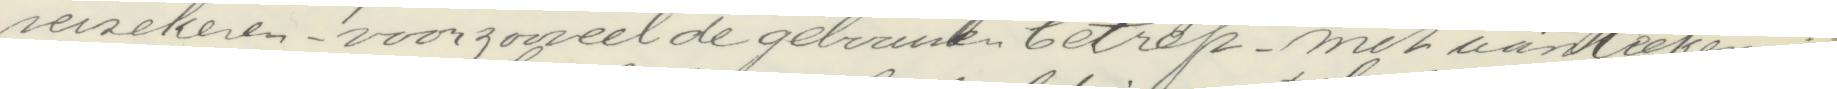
verzekeren - voor zoveel de gebouwen betroft - met aanteekening
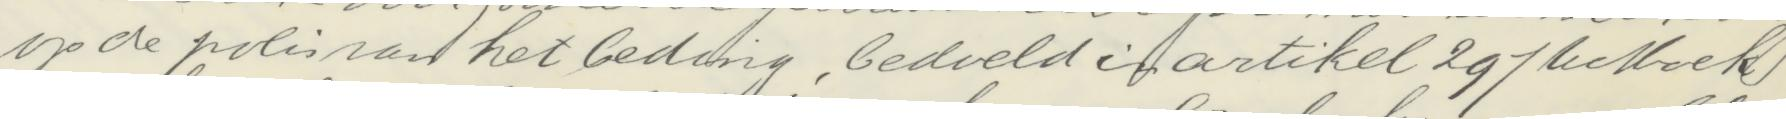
op de polis van het beding, bedoeld is artikel 297 wetboek
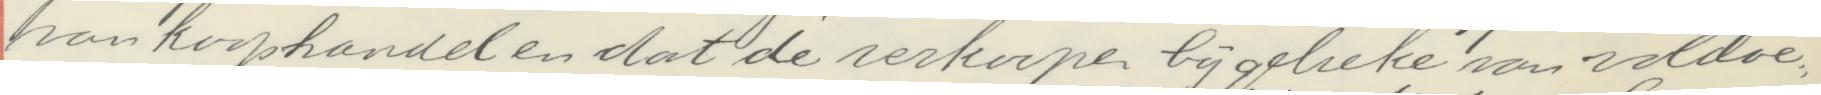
van koophandel en dat de verkooper bij gelieke van voldoe„
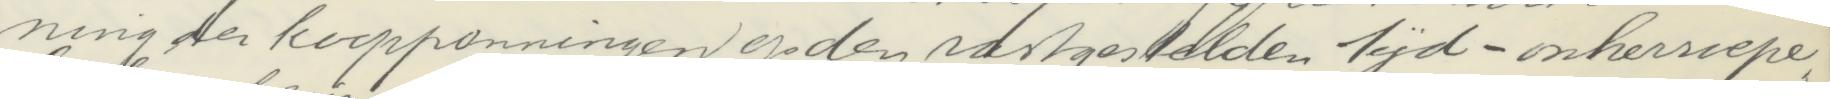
ning der kooppenningen op den vastgestelden tijd - onherroepe„
